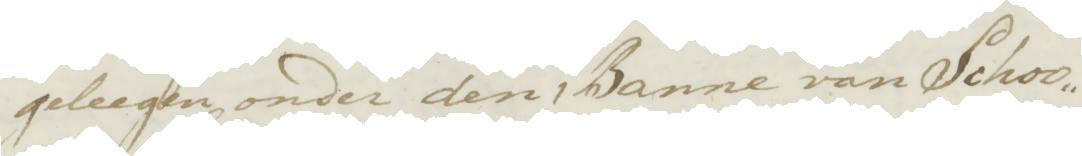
geleegen onder den Banne van Schoo„
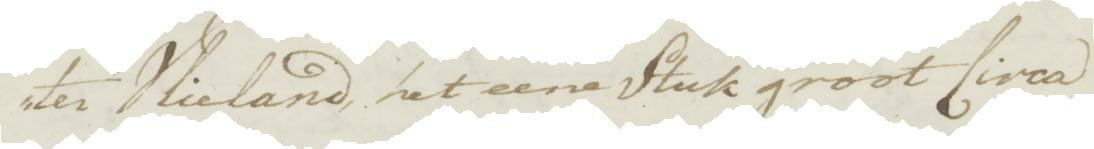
„ter Vlieland, het eene Stuk groot Circa
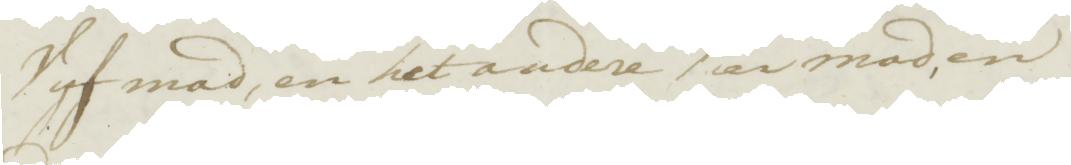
Vyf mad, en het andere Vier mad, en
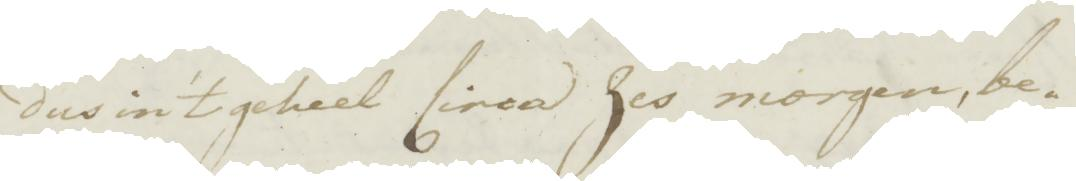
dus in ’t geheel Circa zes morgen, be„
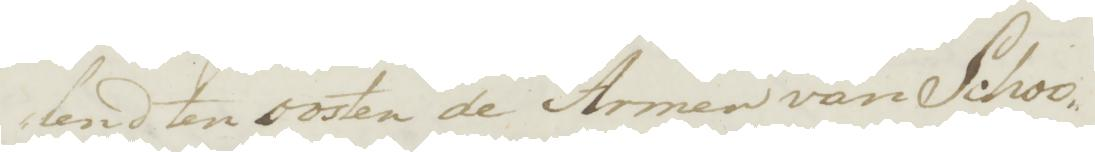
„lend ten oosten de Armen van Schoo„
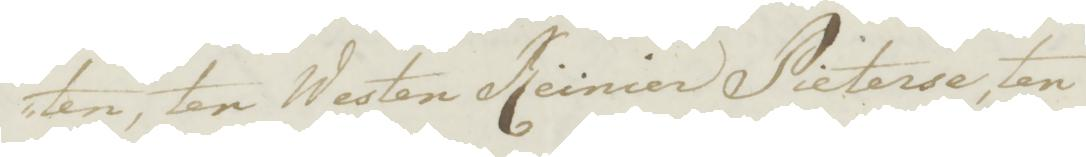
„ten, ten Westen Reinier Pieterse, ten
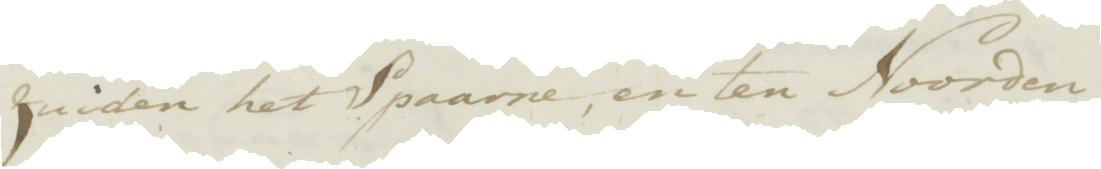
zuiden het Spaarne, en ten Noorden
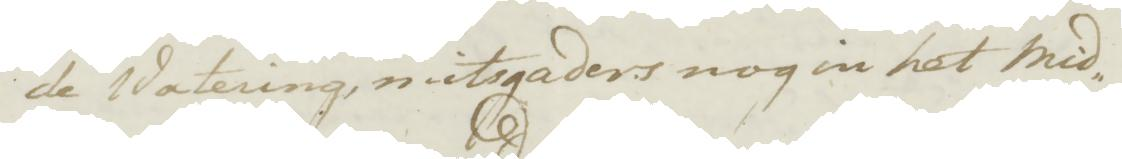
de Watering, mitsgaders nog in het mid„
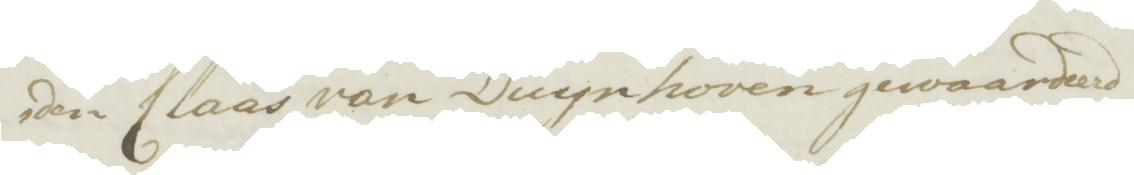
„den Claas van Duynhoven gewaardeerd
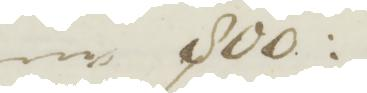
— „ 800:
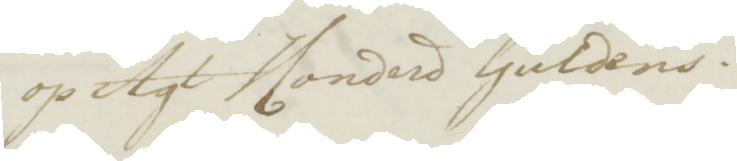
op Agt Honderd Guldens.
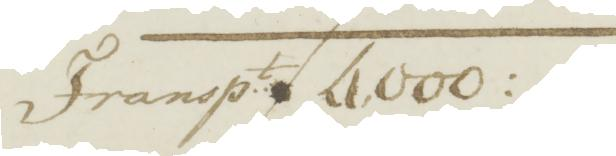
Transp..t ƒ 4000: —
